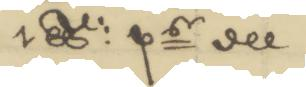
1 lb: p=r ell
